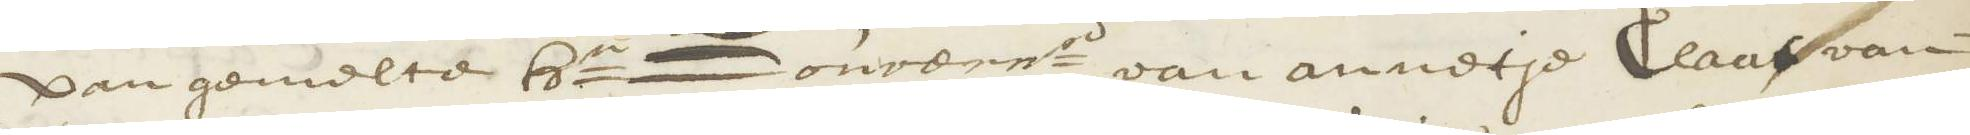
van gemelte H=r Gouvern=r van annetje Claas van
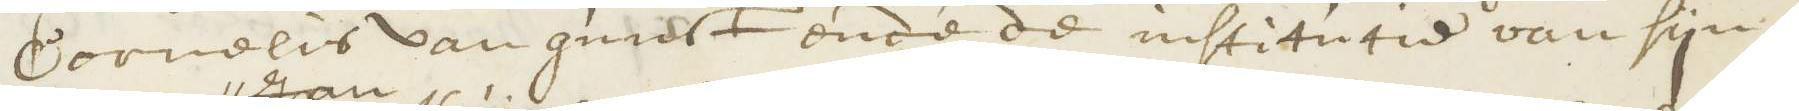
Cornelis van gunst eude de institutie van sijn
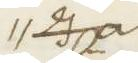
„Jan
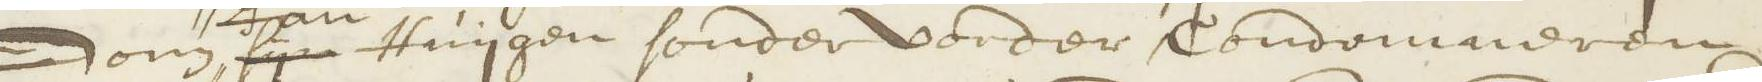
Oom„ sijn Huijgen sonder vorder Condemneren
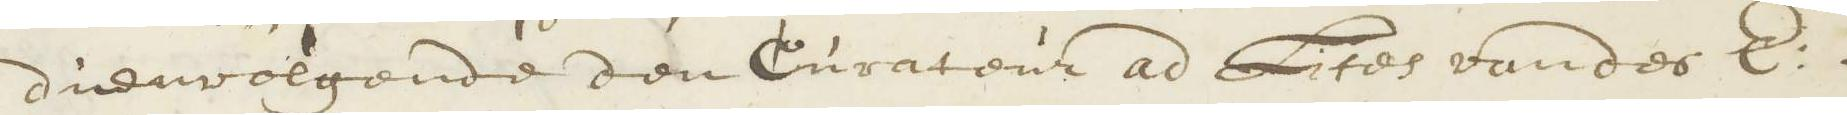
dienvolgende den Curateur ad Lites van der E:
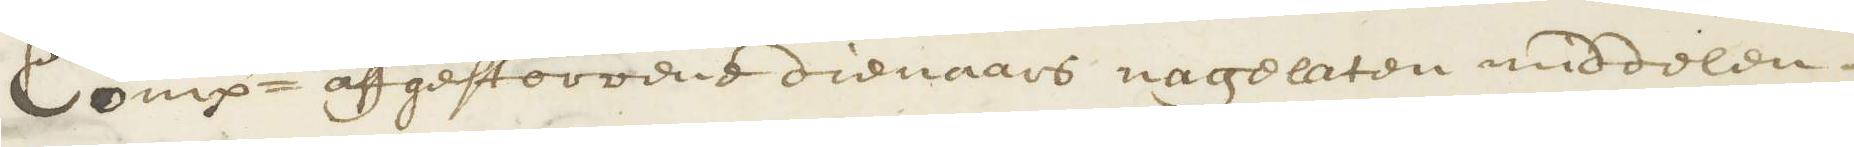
Comp=e afgestorvene dienaars nagelaten middelen
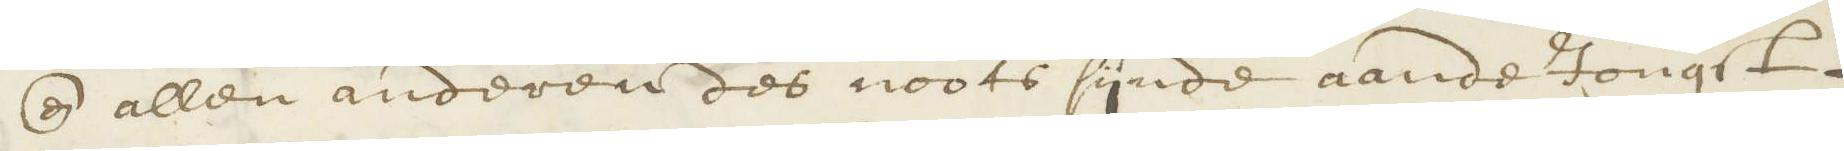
ende allen anderen des noots sijnde aande Iongst
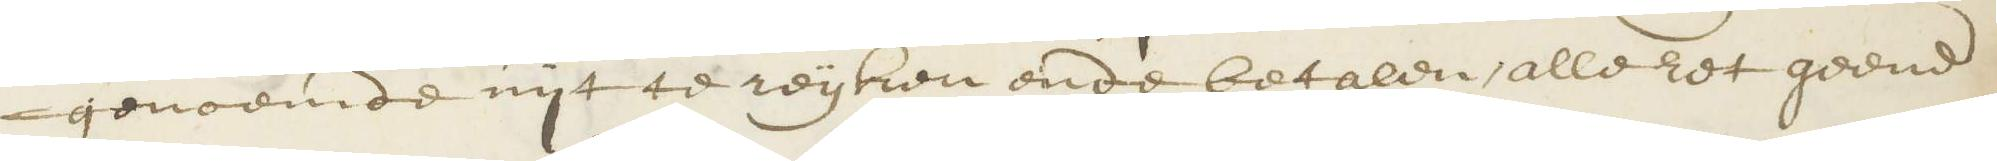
genoemde uijt te reijken ende betalen, alle het geene
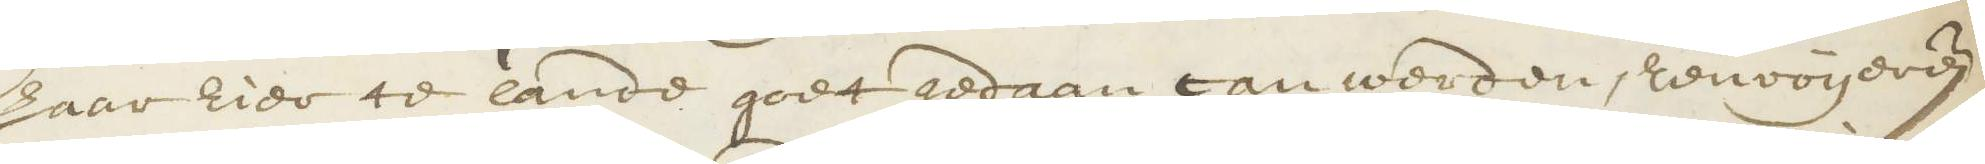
haar hier te lande goet gedaan can werden, renvoijeren
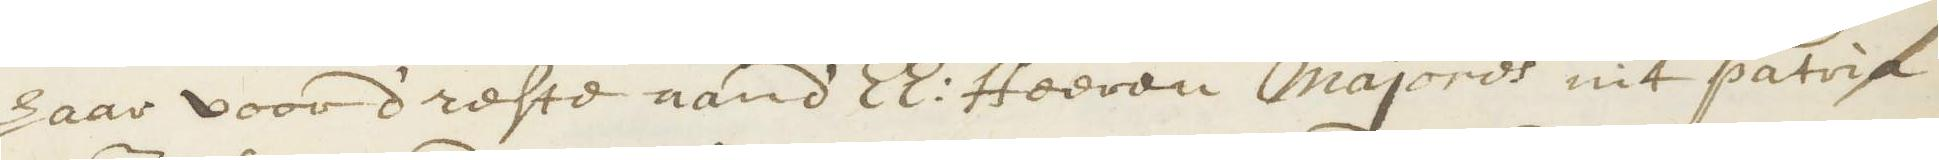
haar voor d' reste aan d’ EE: Heeren Majores in’t patria
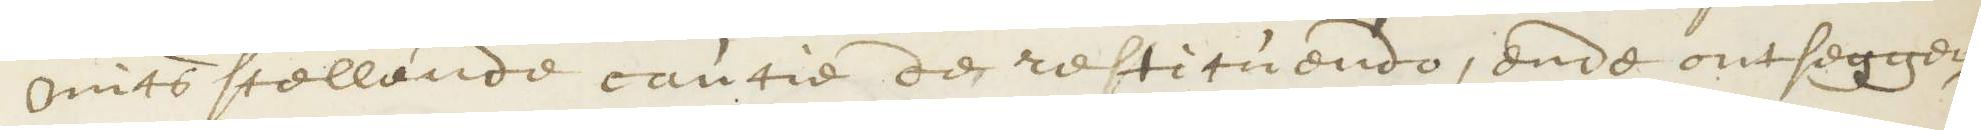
mits stellende cautie de restituendo, ende ontseggen
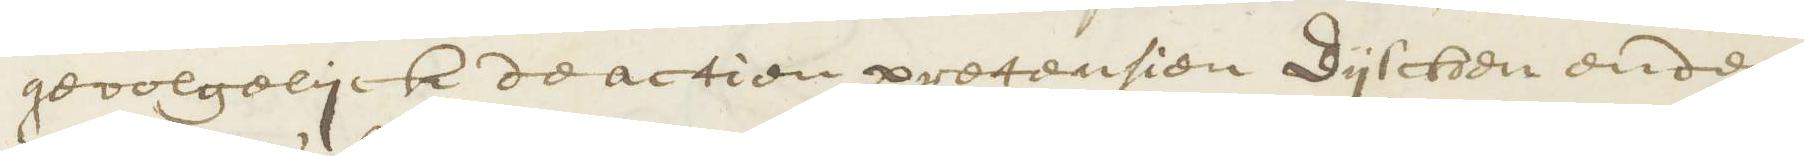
gevolgelijck de actien pretensien Eijschen ende
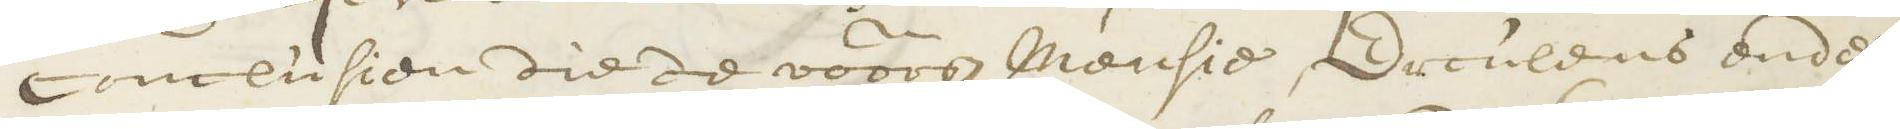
conclusien die de voorsz Mensie, Erculens ende
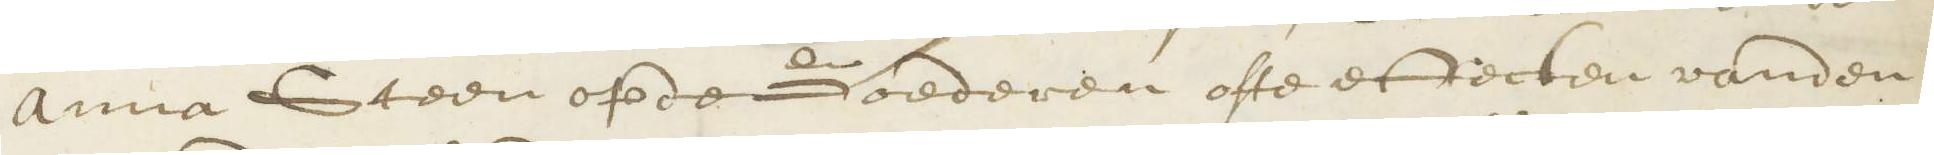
anna steen op de Goederen ofte effecten van den
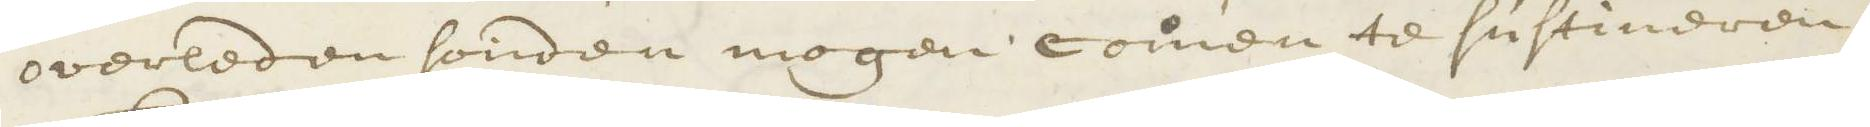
overleden souden mogen comen te sustineren
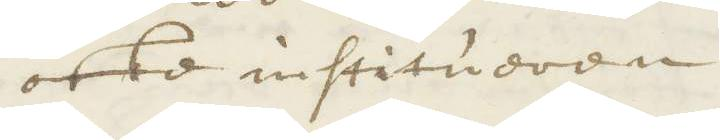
ofte institueren
